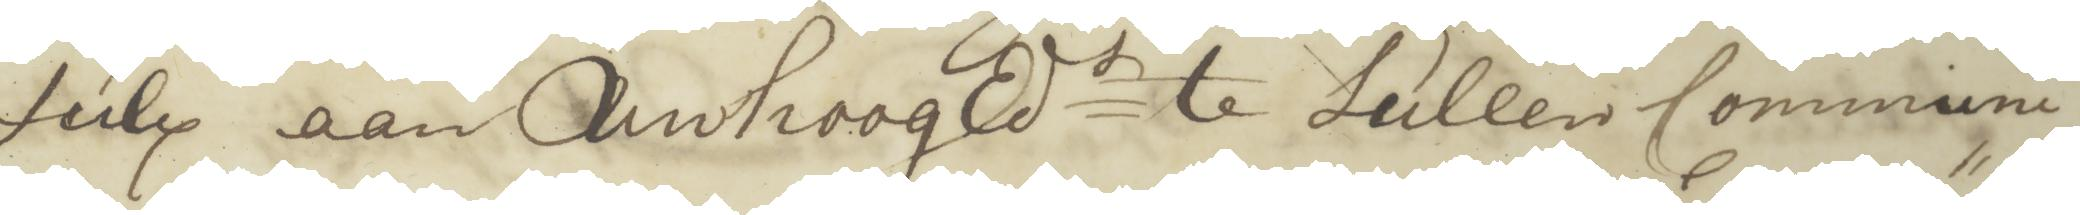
sulx aan uw hoog Ed=s te sullen Communi„
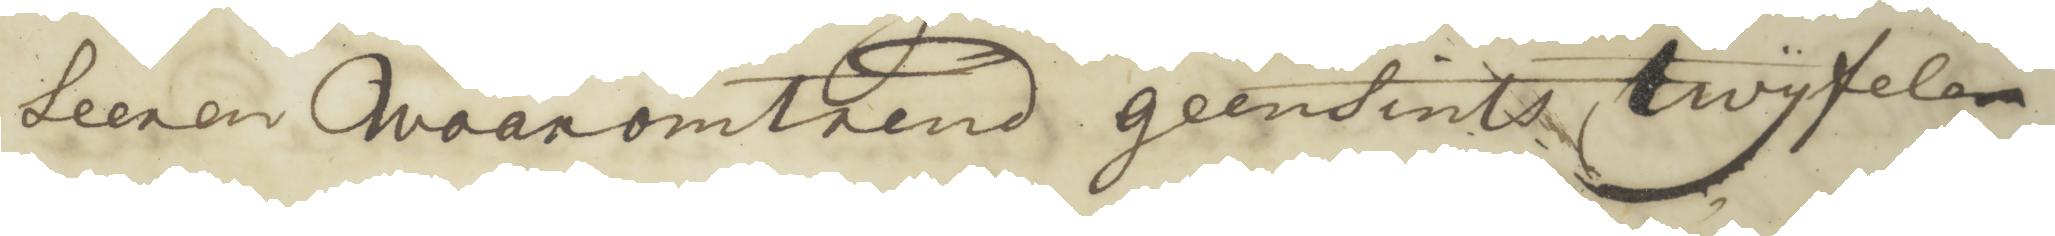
seeren waar omtrend geensints twijfelen
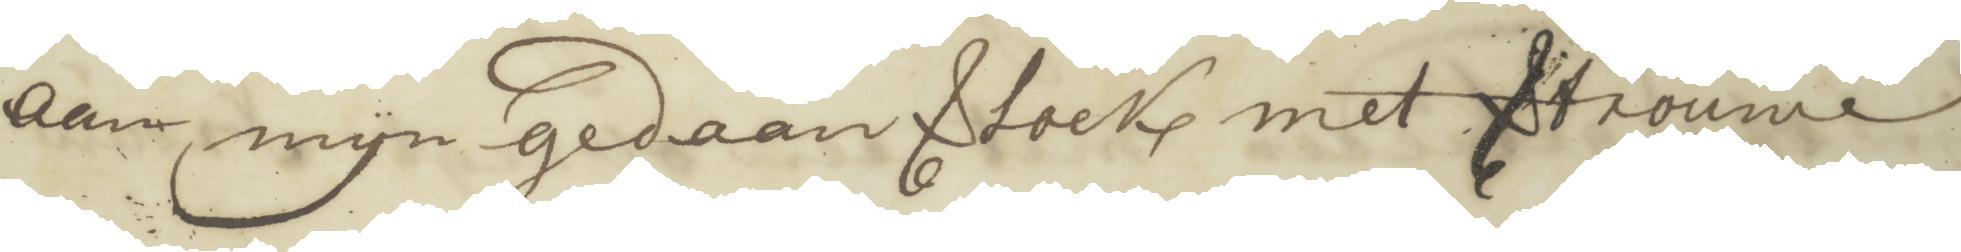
aan mijn gedaan versoek met vertrouwe
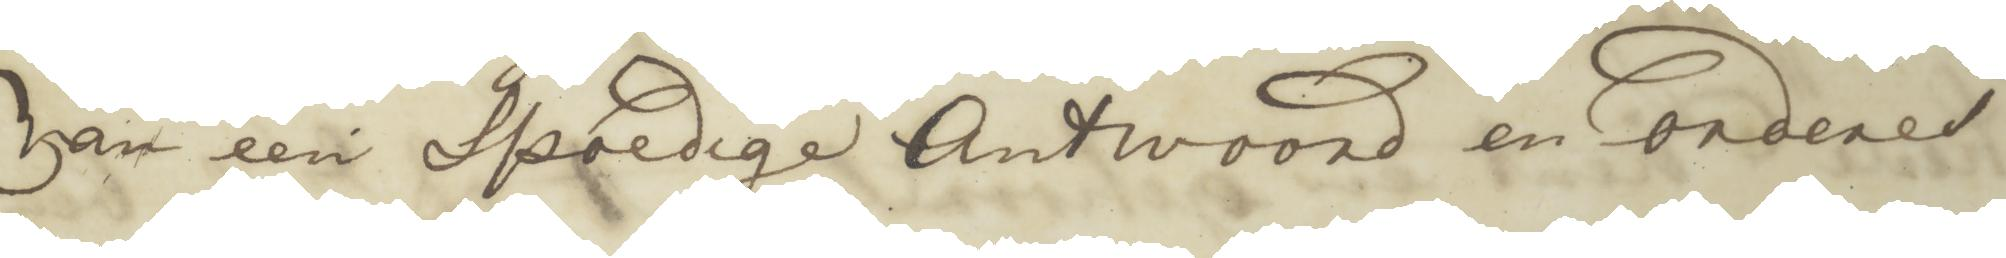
van een spoedige antwoord en orderes
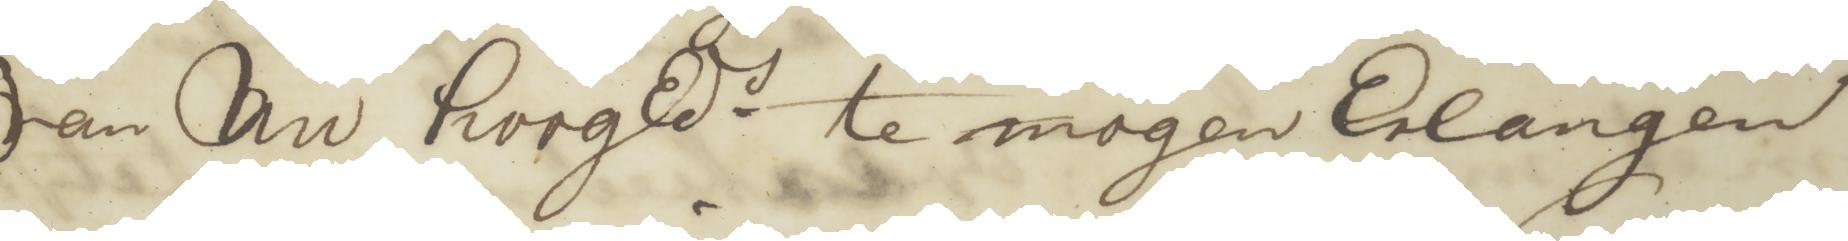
van Uw hoogEd=s te mogen Erlangen
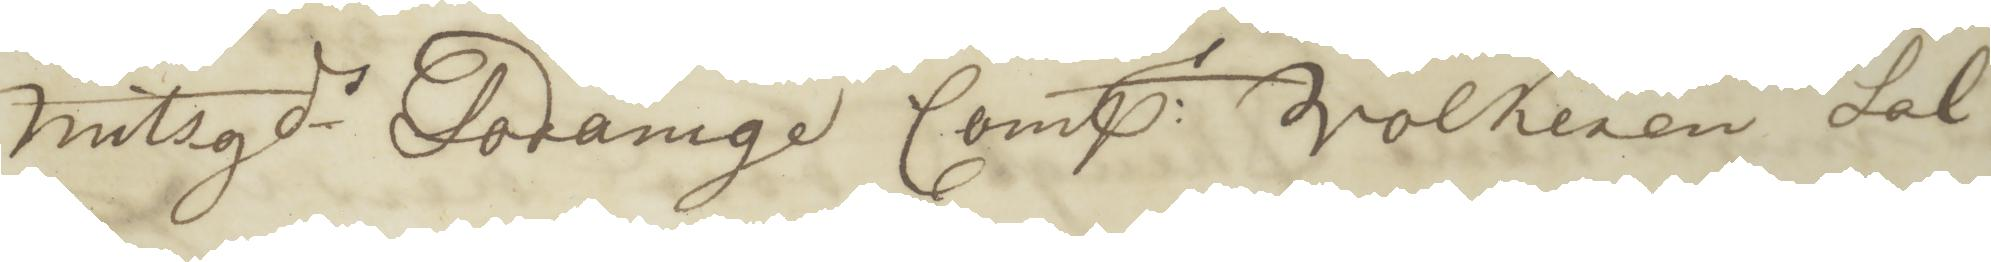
mitsgd=s sodanige Comp:s volkeren sal
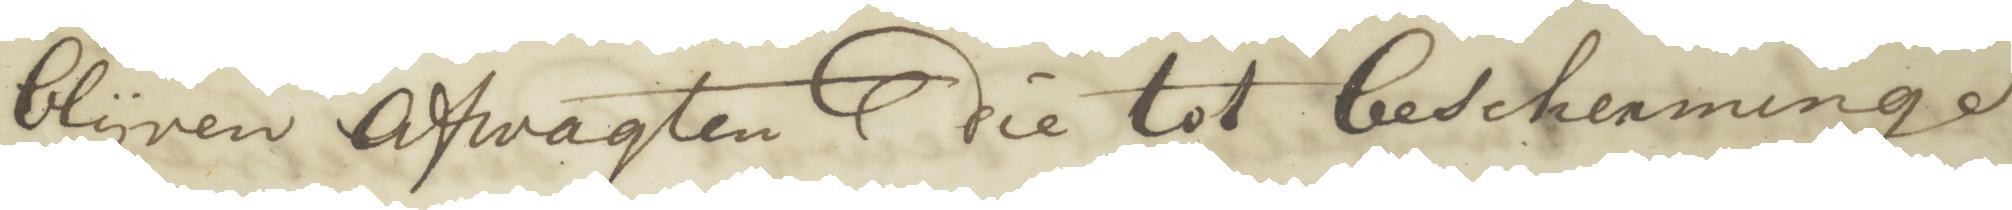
blijven afwagten die tot bescherminge
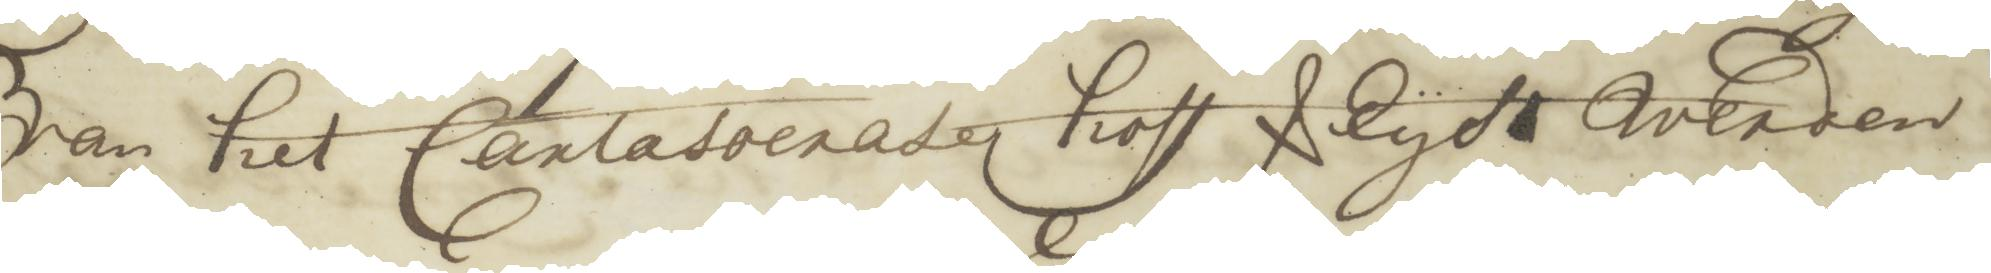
van het Cartasoerase hoff verEijst werden
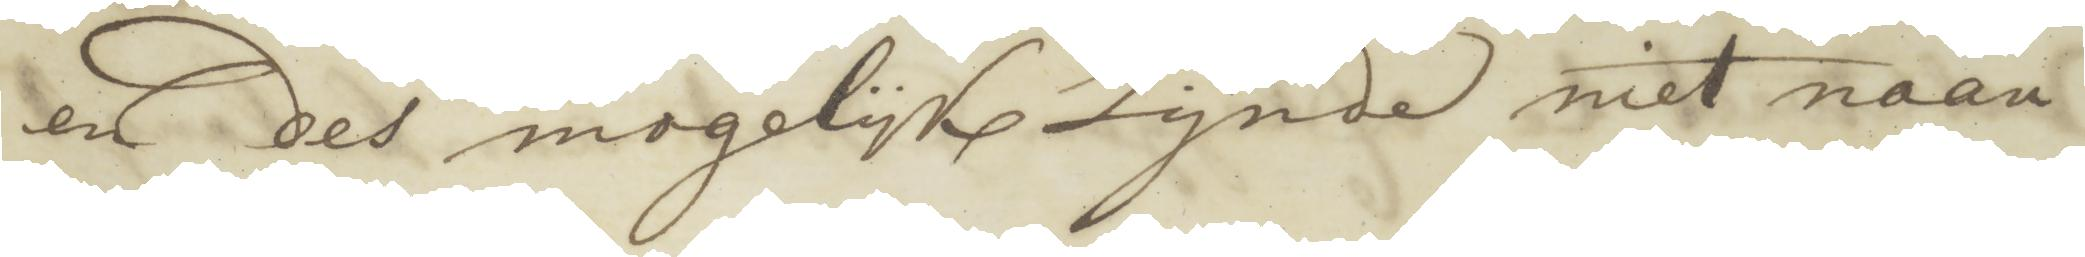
en des mogelijk zijnde niet naar
